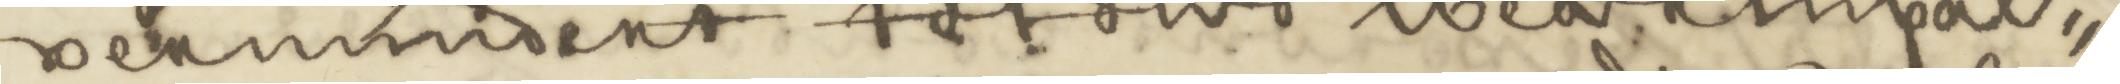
vermindert tot dies wederinpal„
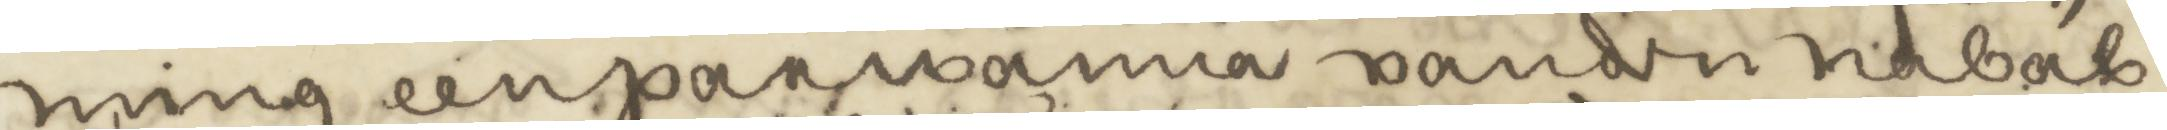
ming een parwanna van den nabab
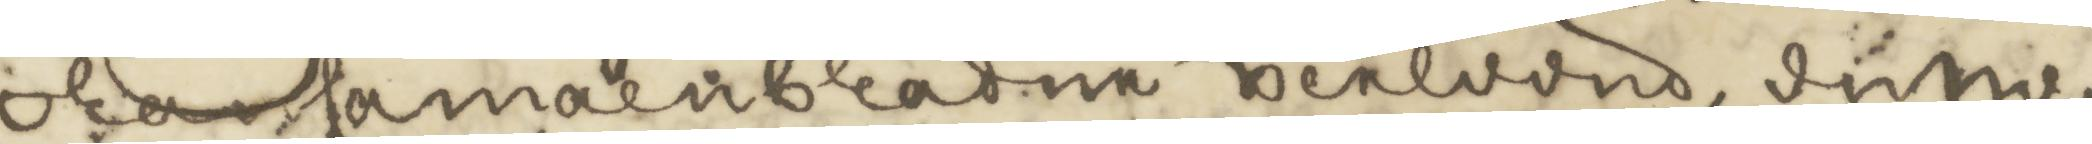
Chan samaen bhadur verleend, en ne„
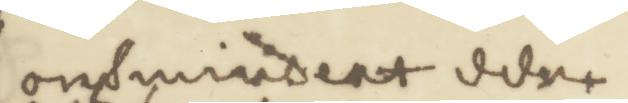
onvermindert een
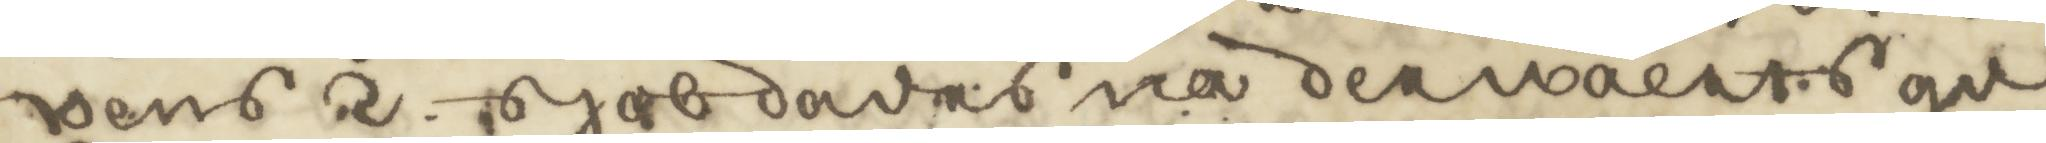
vens 2. sjabdaers na derwaerts ge
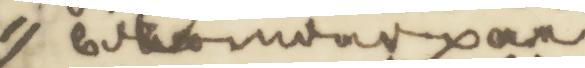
bekomene par
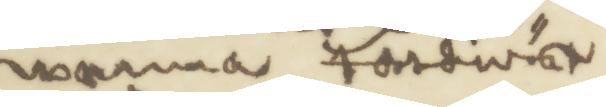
wanna tot diest
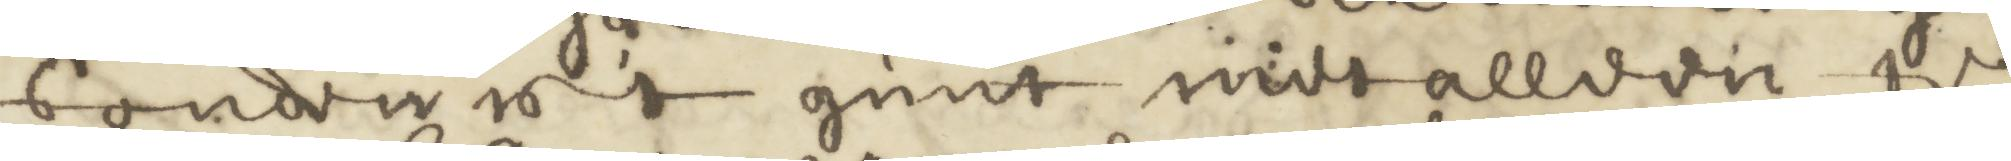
sonden is 't gunt niet alleen te
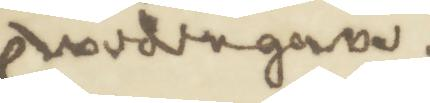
wedergave.
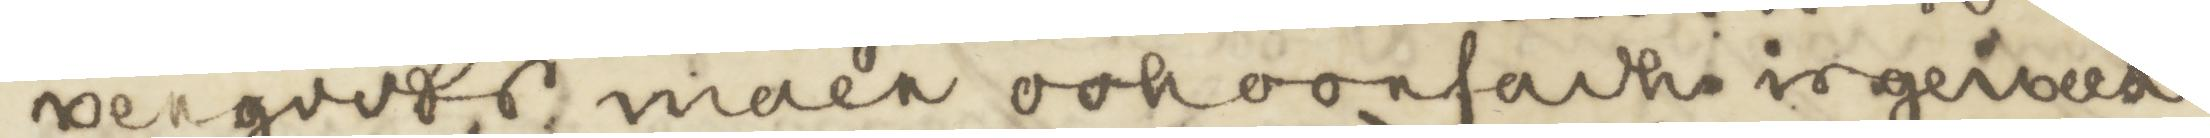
vergeefs maer ook oorsaek is geweest
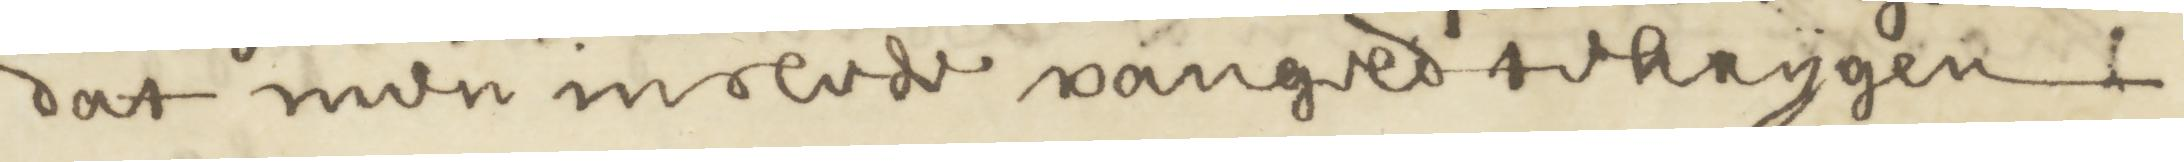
dat men instede van geld te krijgen
